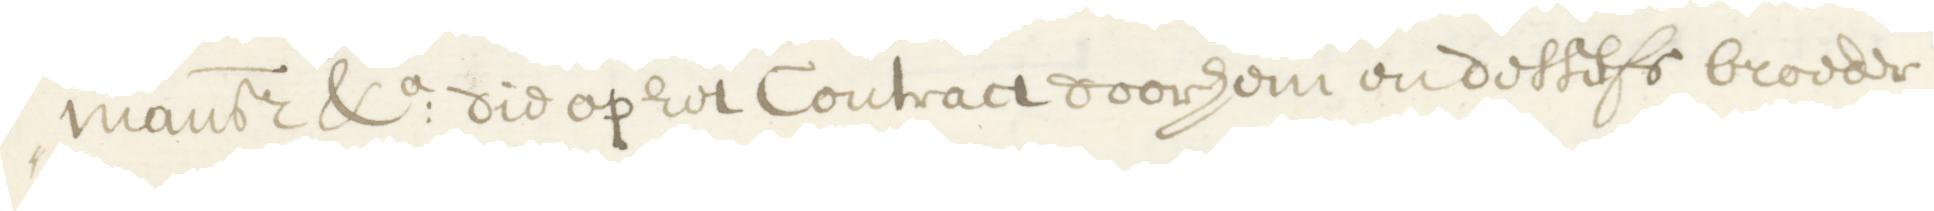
„mansz &:a die op het Contract door hem en desselfs broeder
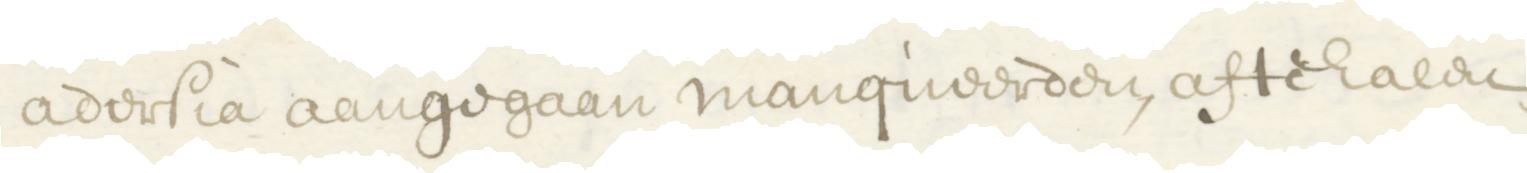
adersia aangegaan manqueerden, aftehalen
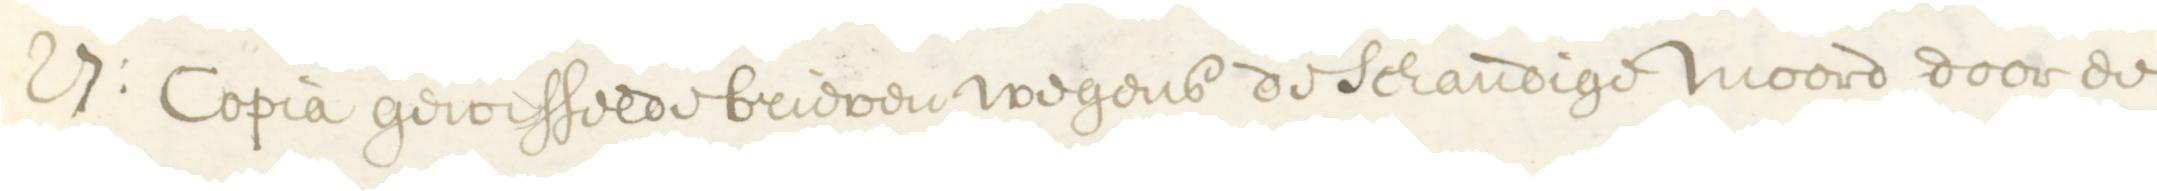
27: Copia gewisselde brieven wegens de schandige moord door de
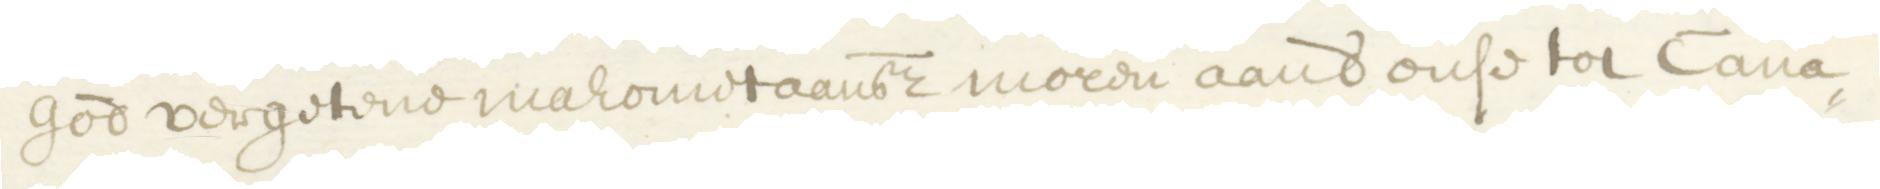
god vergetene mahometaansz moren aan d' onse tot Cana„
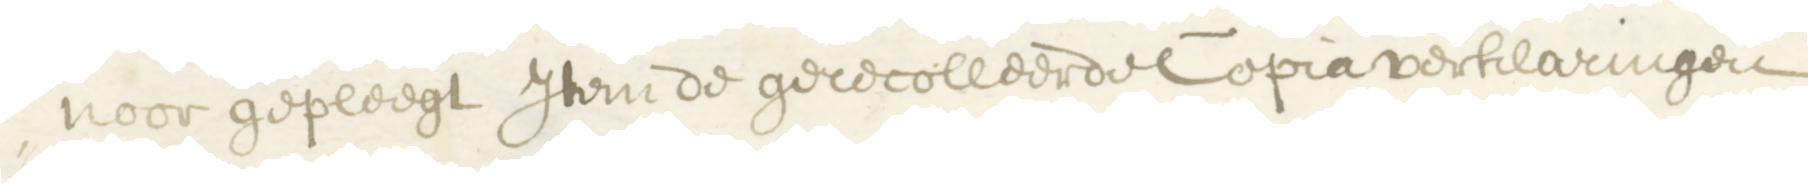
„noor gepleegt Jtem de gerecolleerde Copia verklaringen
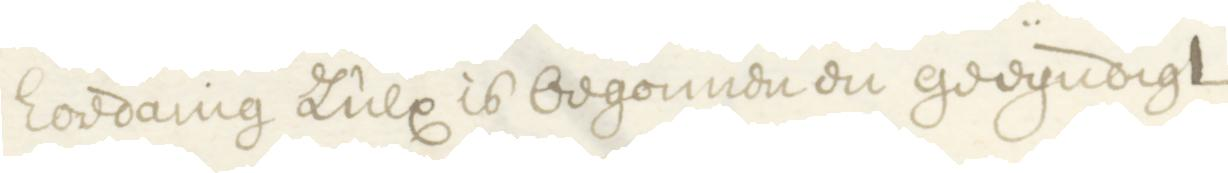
hoedanig zulx is begonnen en geeijndigt
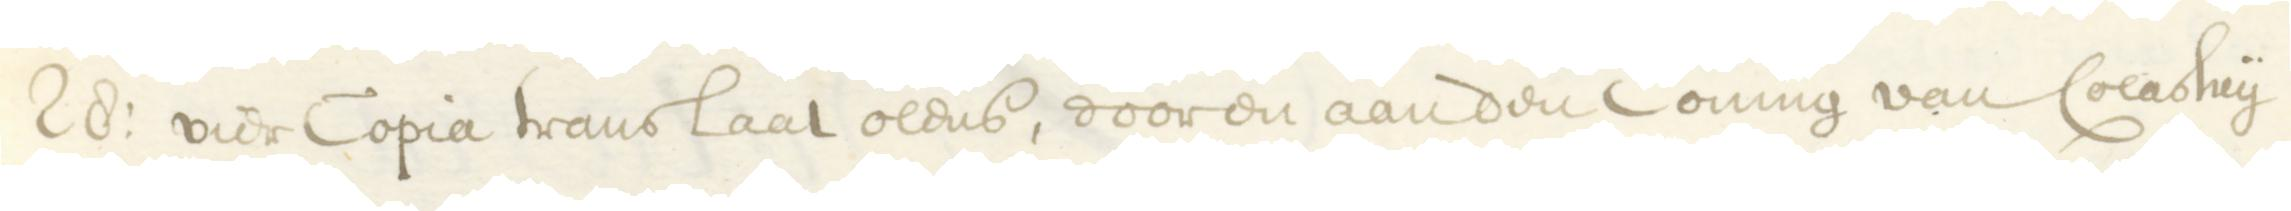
28: vier Copia translaat olens, door en aan den Coning van Colastuij
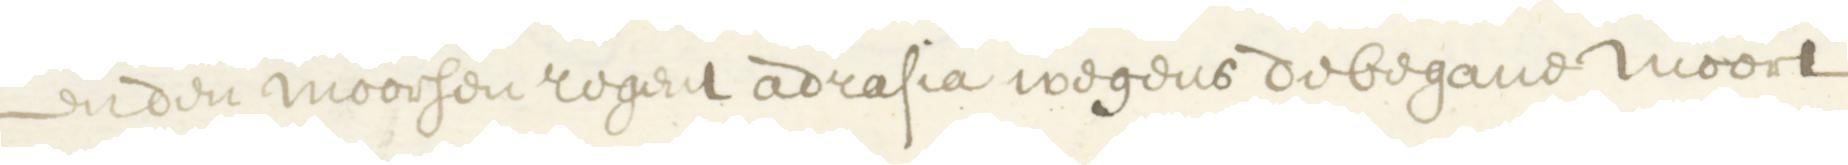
en den moorsen regent adrasia wegens de begane moort
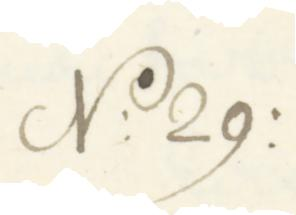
N:o 29:
